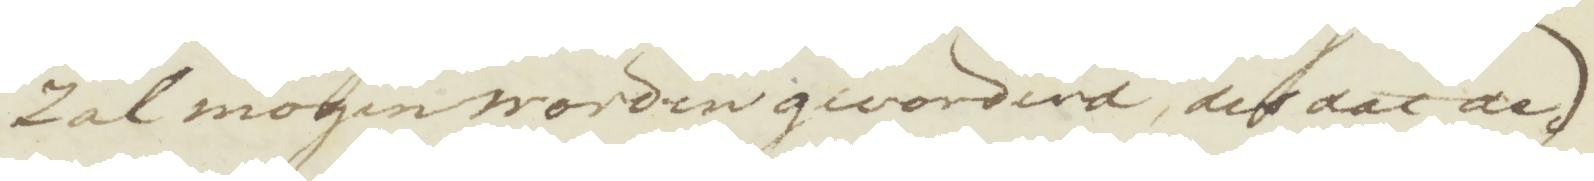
zal mogen worden gevorderd, des dat de
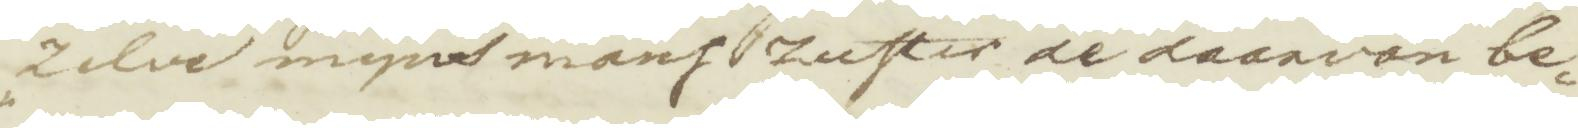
zelve myns mans zuster de daarvan be„
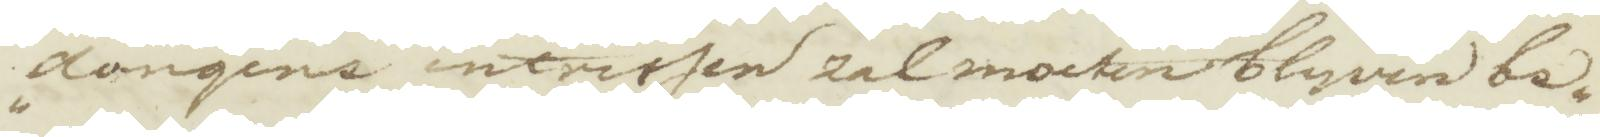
„dongene intressen zal moeten blyven be„
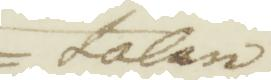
=talen
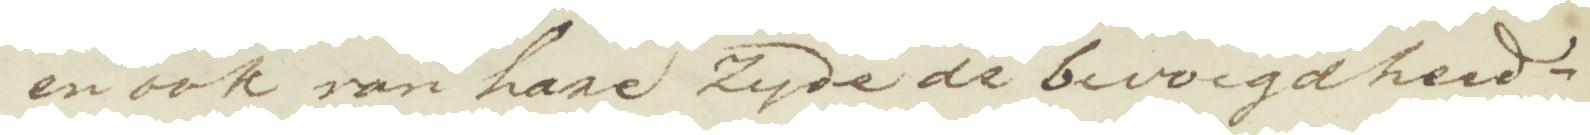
en ook van hare zyde de bevoegdheid-
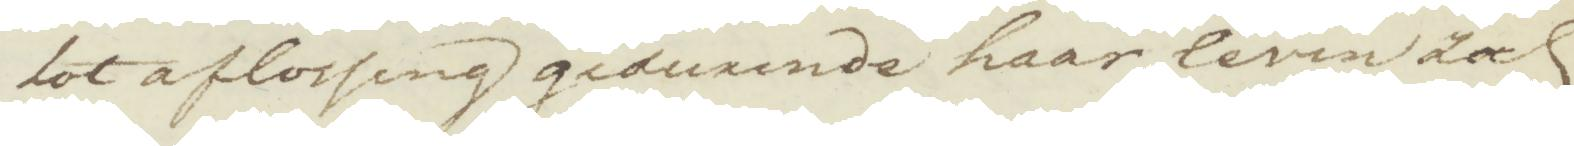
tot aflossing gedurende haar leven zal
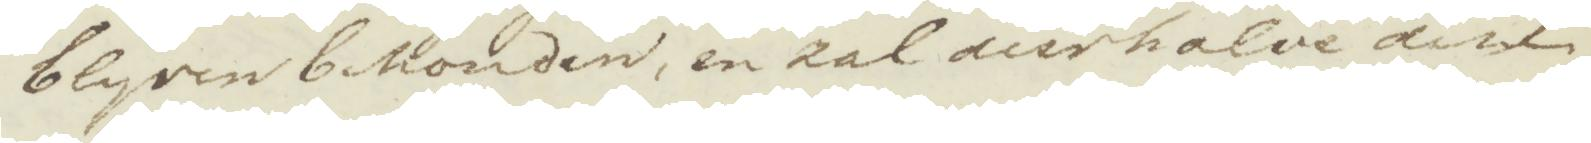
blyven behouden, en zal dierhalve deze
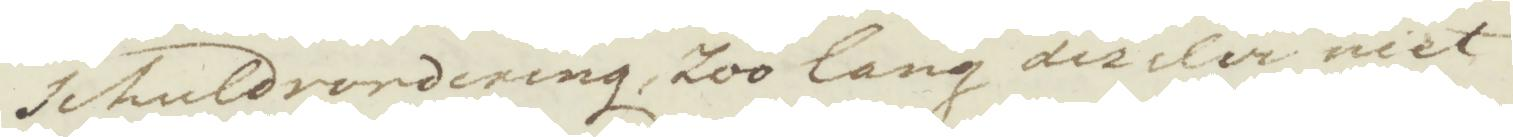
schuldvordering, zoo lang dezelve niet
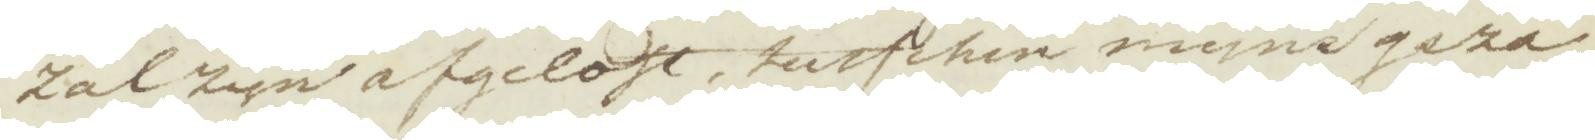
zal zyn afgelost, tusschen myne geza
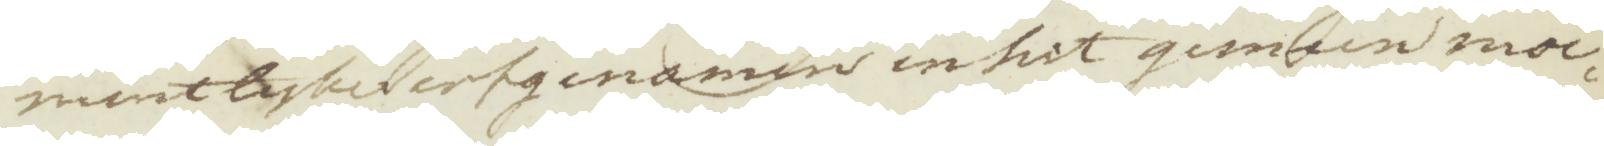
,mentlyke erfgenamen in het gemeen moe„
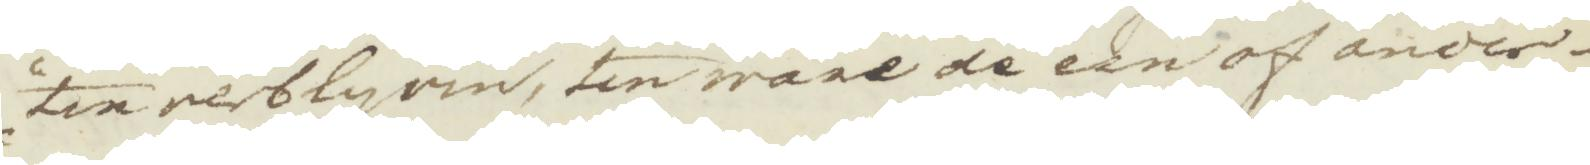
„ten verblyven, ten ware de een of ander
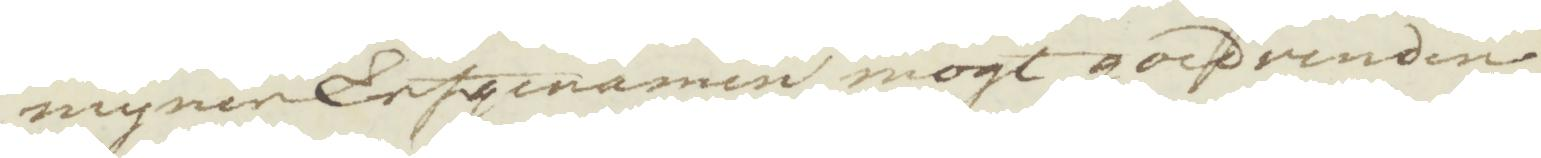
mynen Erfgenamen mogt goedvinden
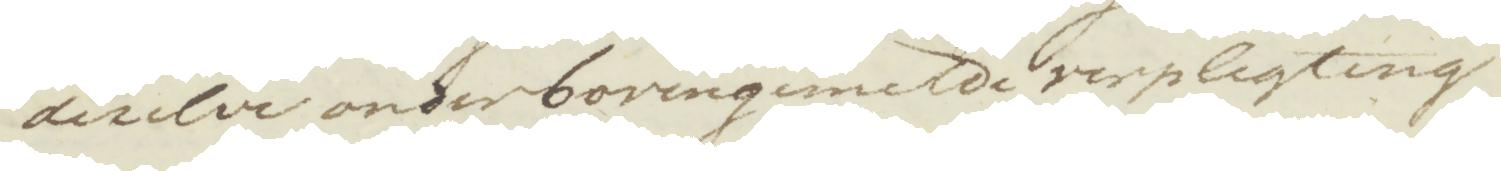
dezelve onder bovengemelde verpligting
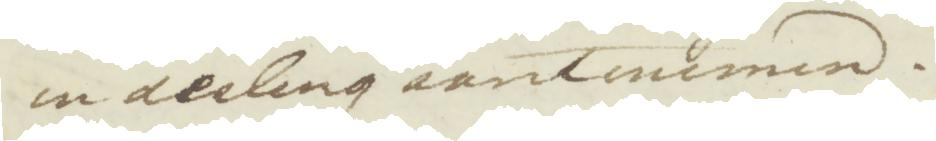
in deeling aantenemen.
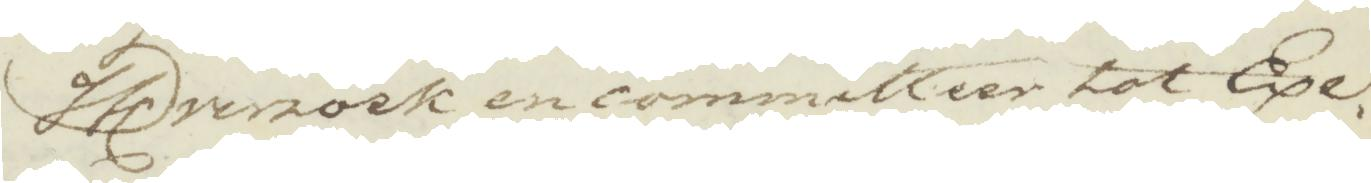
Ik verzoek en committeer tot Exe„
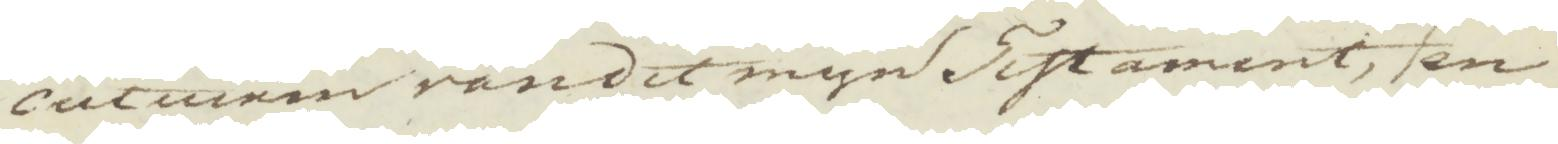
cuteuren van dit myn Testament, en
